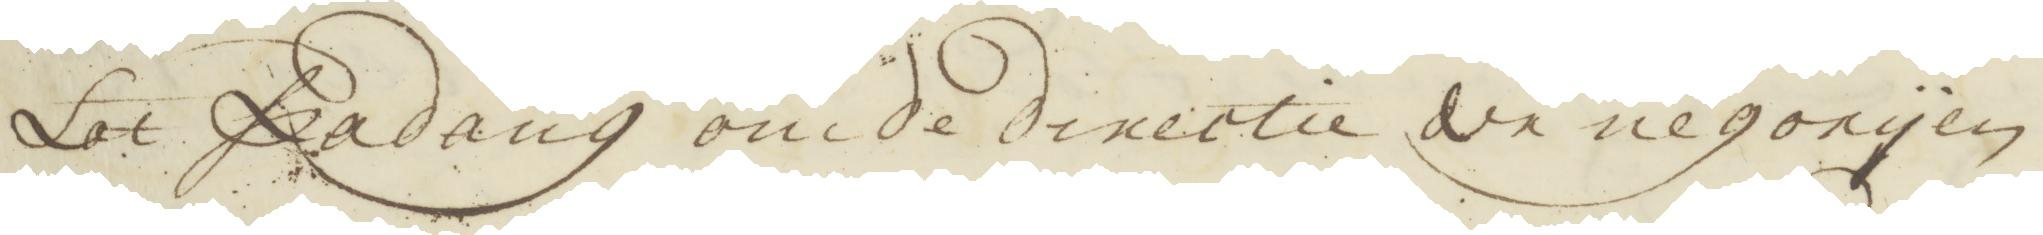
tot Padang om de directie der negorijen
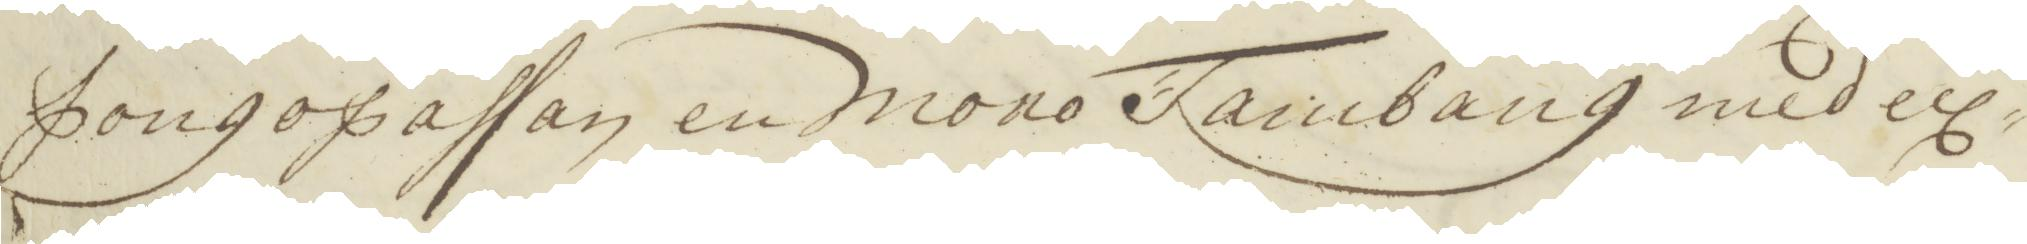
pong op assan en Moro Tambang med ex„
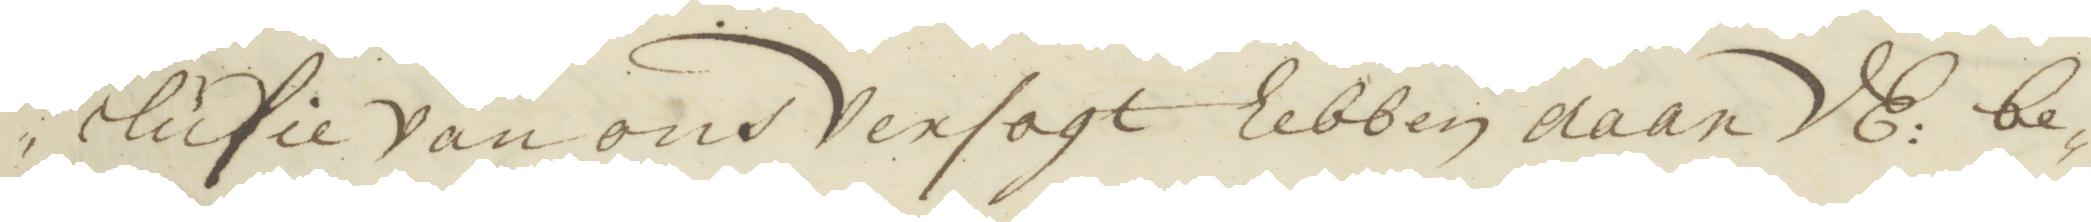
„ clusie van ons versogt hebben daar VE: be=
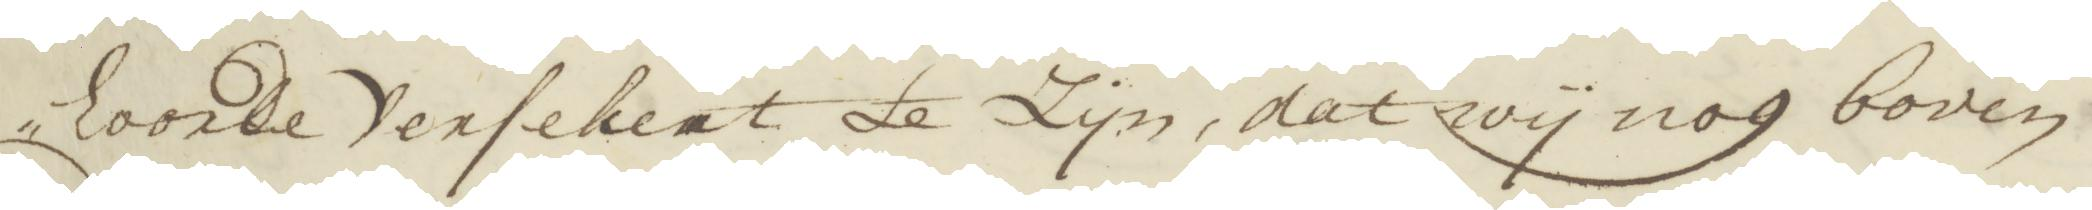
„ hoorde versekert te Zijn, dat wij nog boven
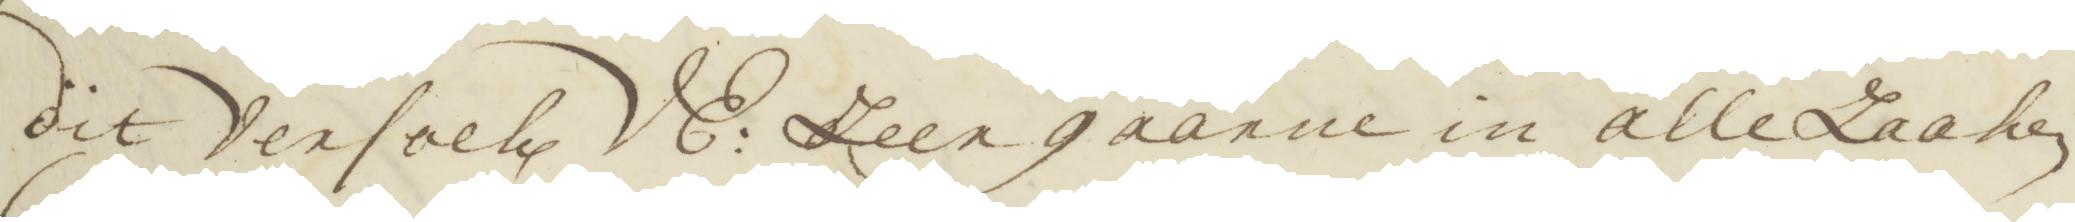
dit versoek VE: zeer gaarne in alle Zaaken
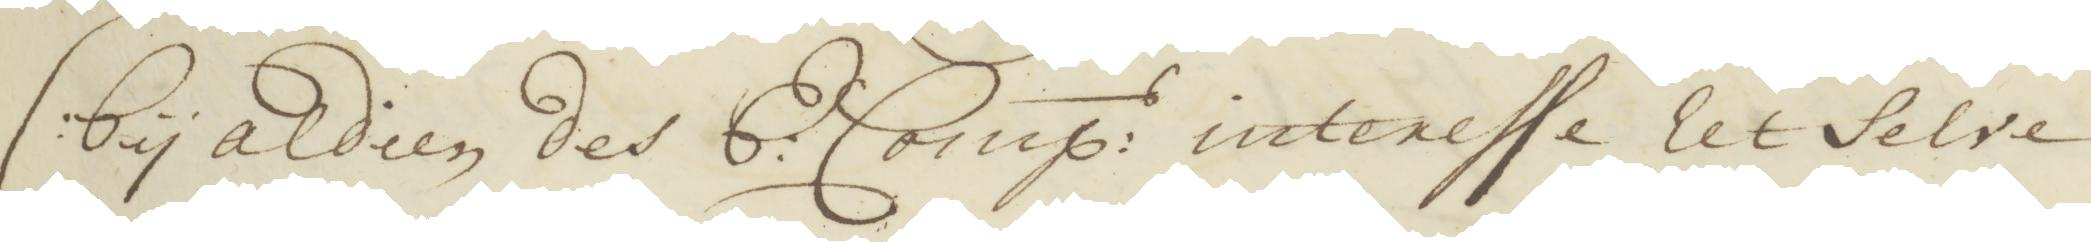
( :bij aldien des E: Comp:s interesse het selve
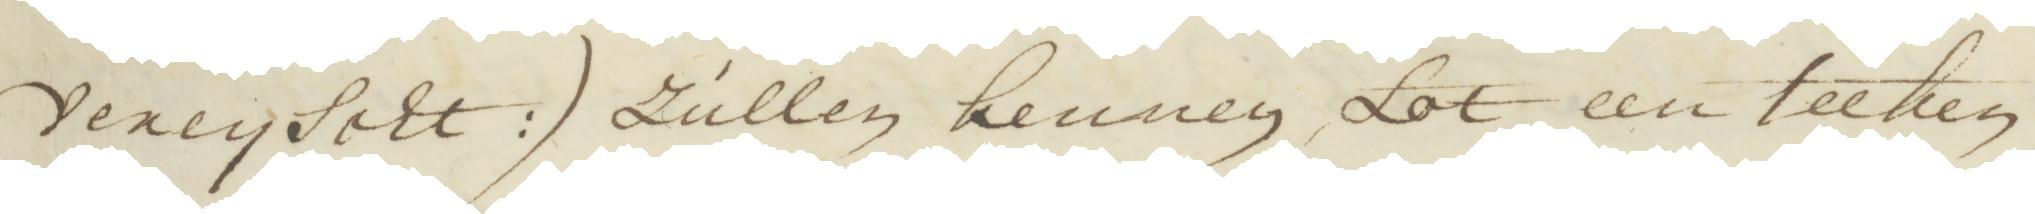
vereijscht :) zullen kennen tot een teeken
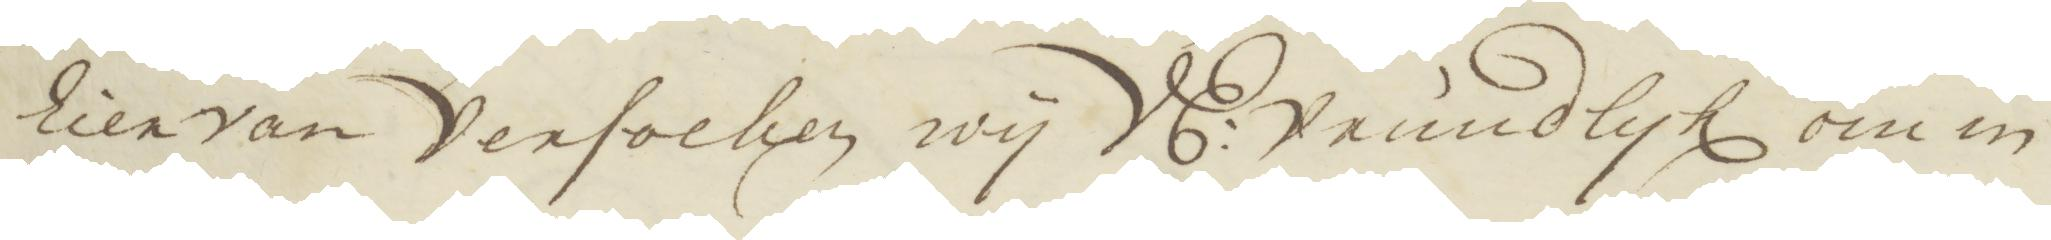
hier van versoeken wij VE: vrundlyk om in
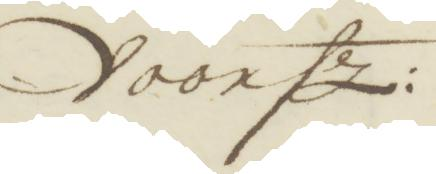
voorsz:
